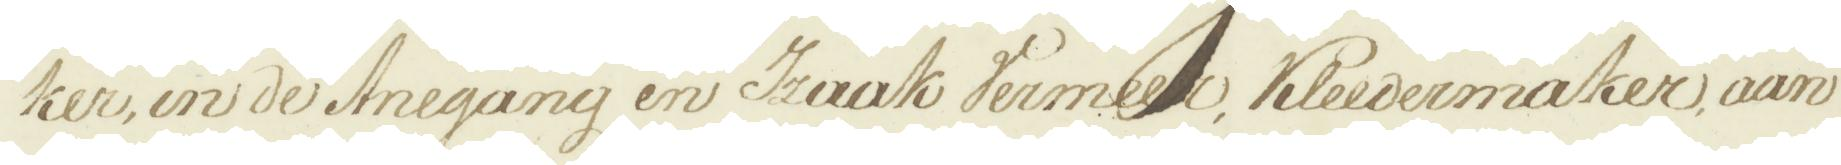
ker, in de Anegang en Izaak Vermeer, Kleedermaker, aan
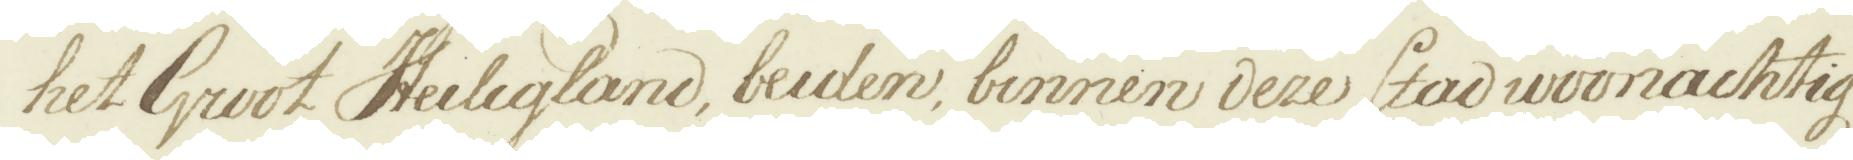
het Groot Heiligland, beiden, binnen deze Stad woonachtig
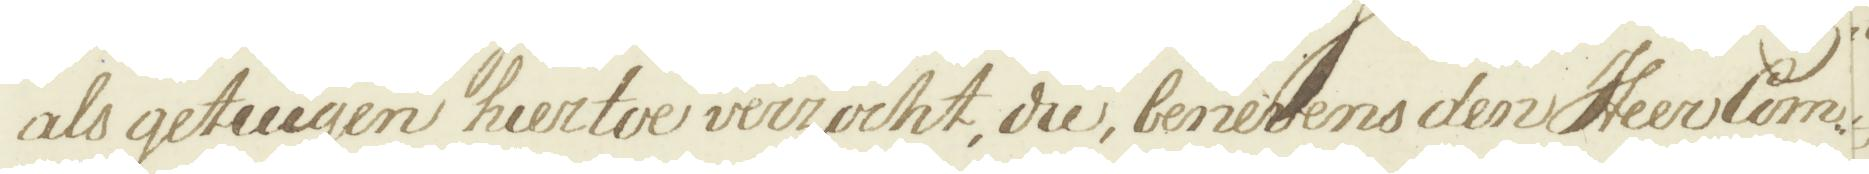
als getuigen hiertoe verzocht, die, benevens den Heer Com„
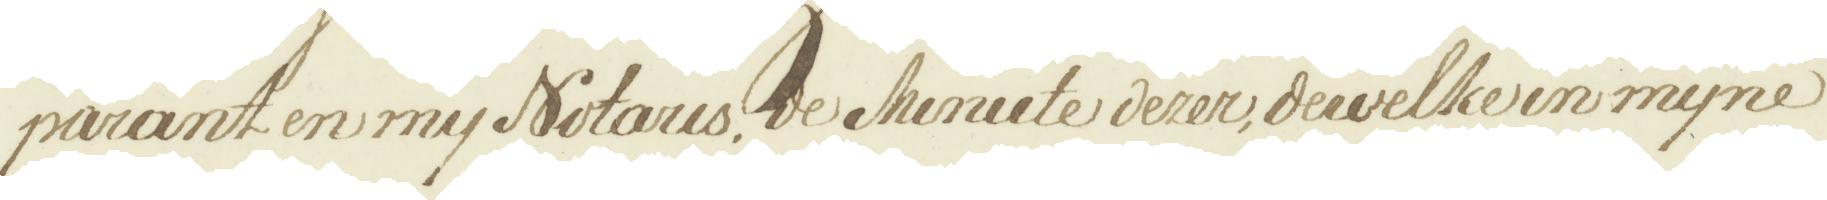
parant en my Notaris, de Minute dezer, dewelke in myne
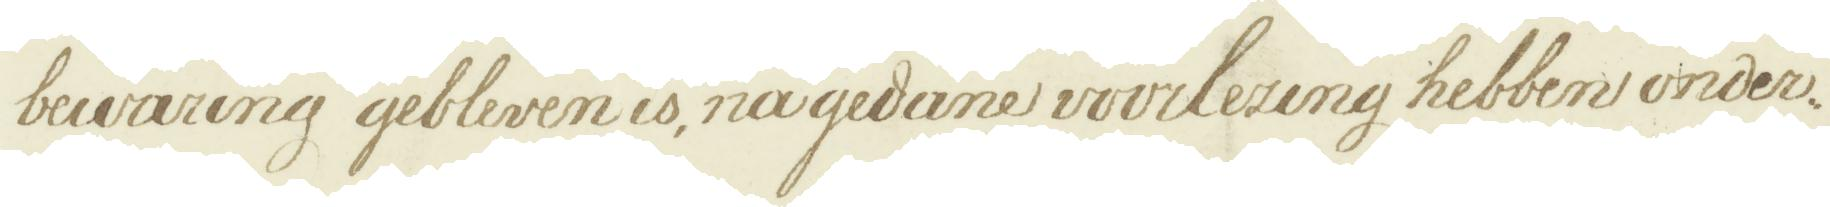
bewaring gebleven is, na gedane voorlezing hebben onder„
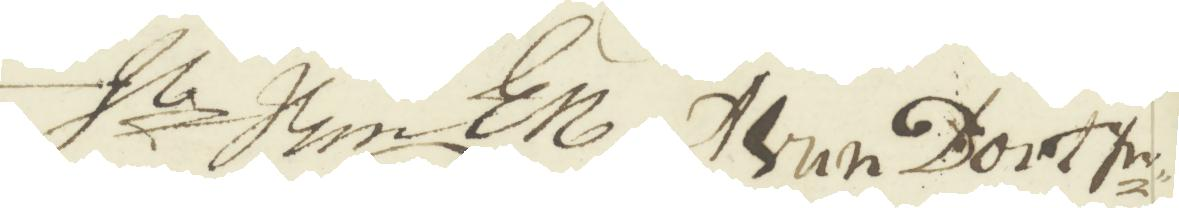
Jb Van Ek A van Dort j=r,
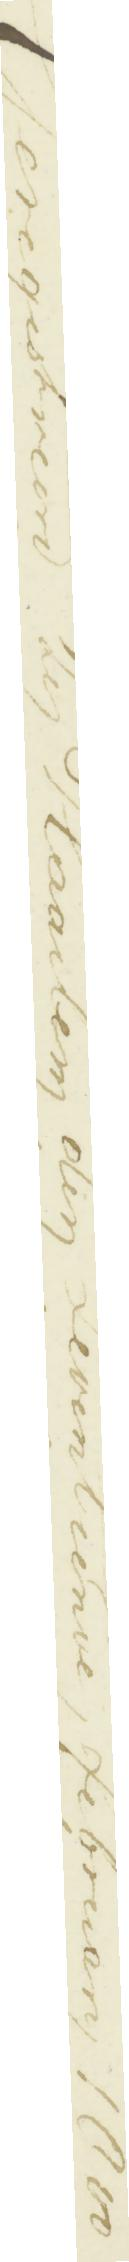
Geregistreerd te Haarlem den Zeventien den February 1800
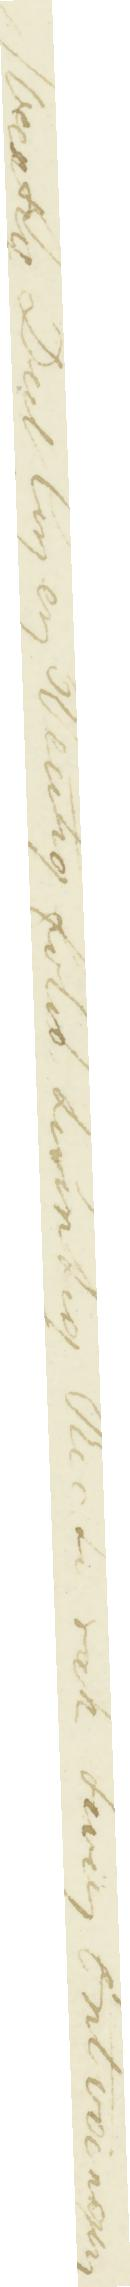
veertig Deel Een en Veertig folio Zeventig Recto vak twee Ontvangen
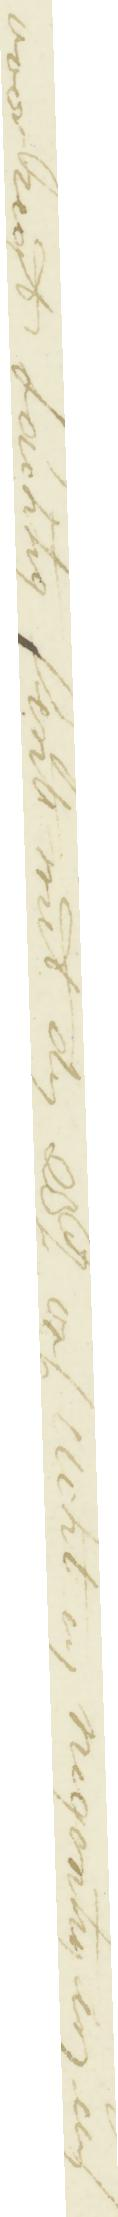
voor regt tachtig Cent met den 23% opC Acht en Negentig en een
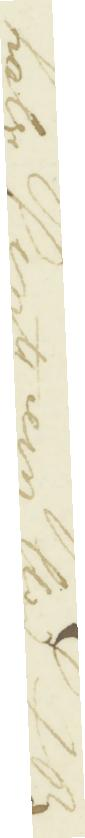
halve Cent een bl. ZR
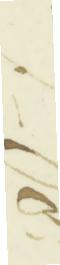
ƒ - 98½
